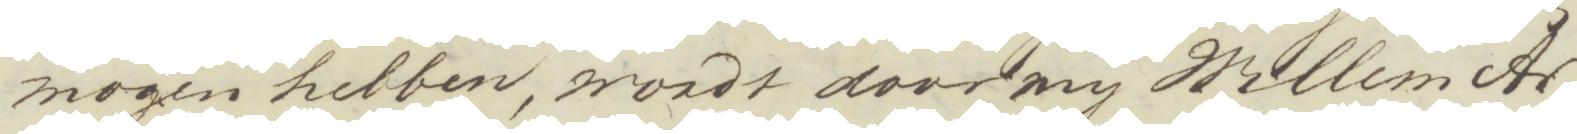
mogen hebben, wordt door my Willem Ar:
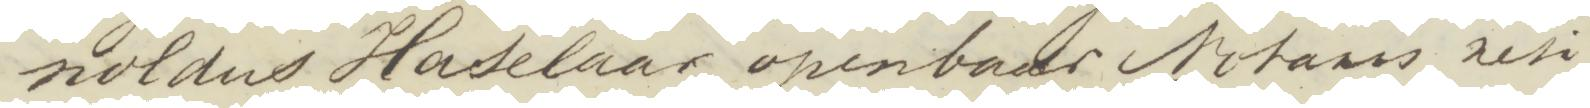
=noldus Haselaar, openbaar Notaris, resi:
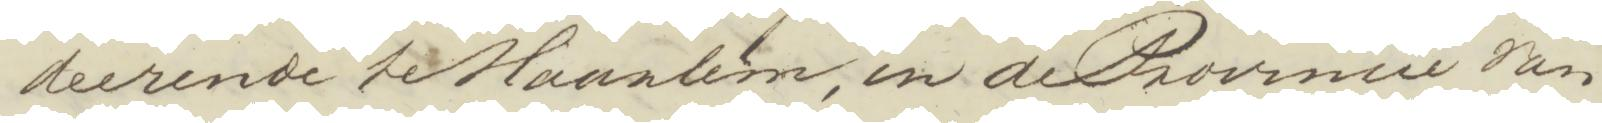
=deerende te Haarlem, in de Provincie van
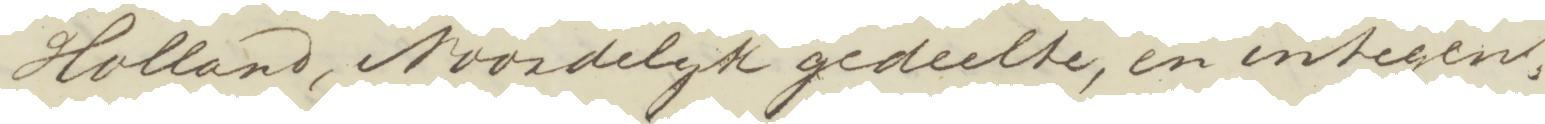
Holland, Noordelyk gedeelte, en integen:
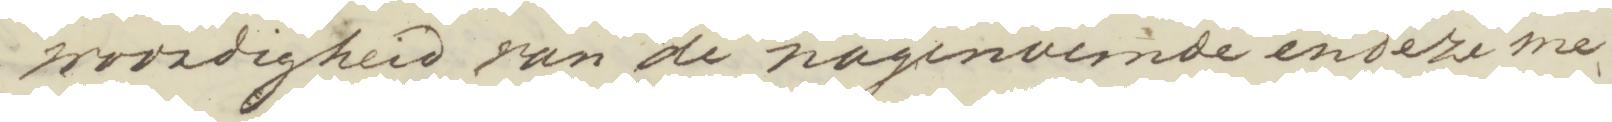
=woordigheid van de nagenoemde en deze me:
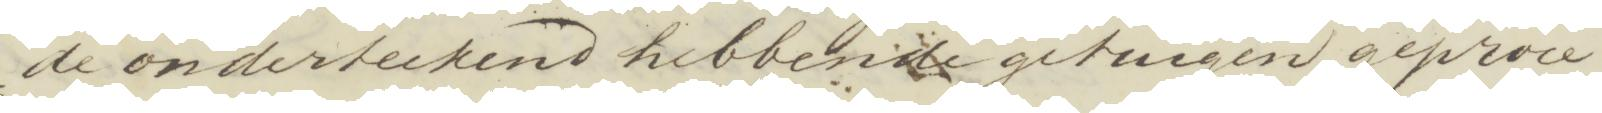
=de onderteekend hebbende getuigen geproce,
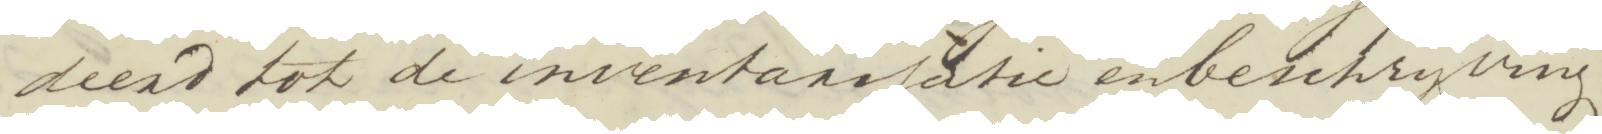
=deerd tot de inventaritatie en beschryving
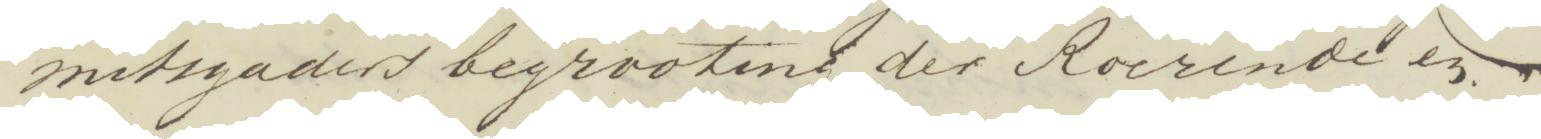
mitsgaders begrooting der Roerende en
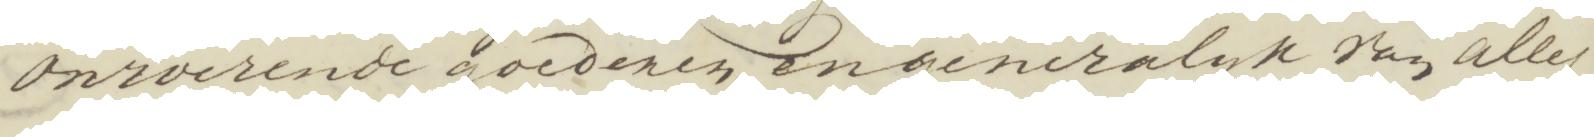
onroerende goederen en generalyk van alles
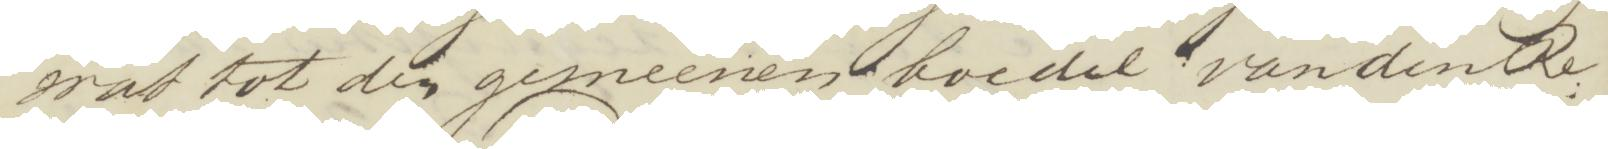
wat tot den gemeenen boedel van den Re:
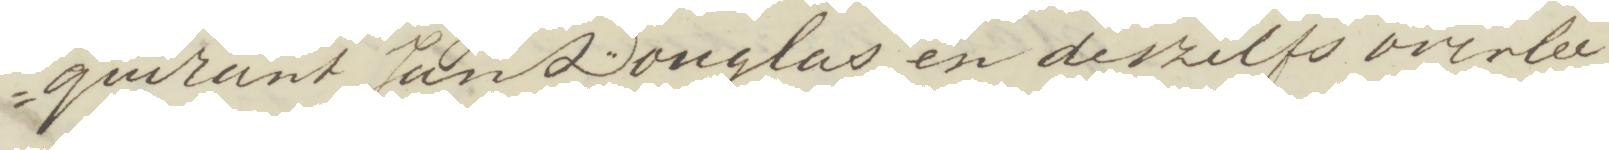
=quirant Jan Douglas en deszelfs overlee=
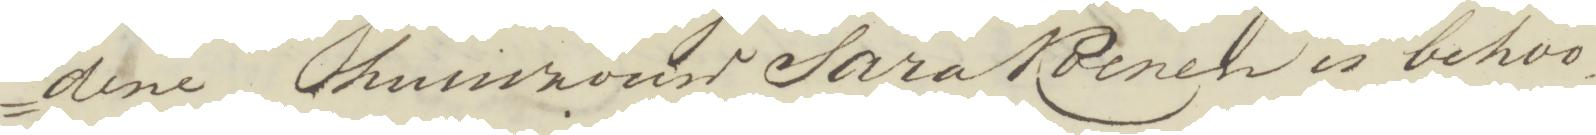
=dene huisvrouw Sara Koenen is behoo:
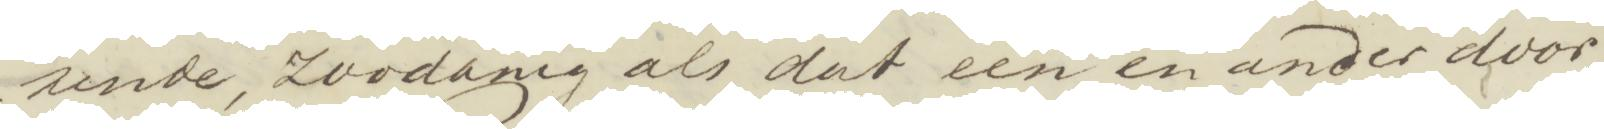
=rende, zoodanig als dat een en ander door
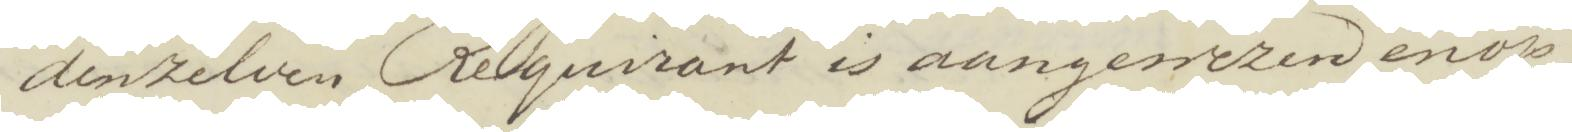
denzelven Requirant is aangewezen en op=
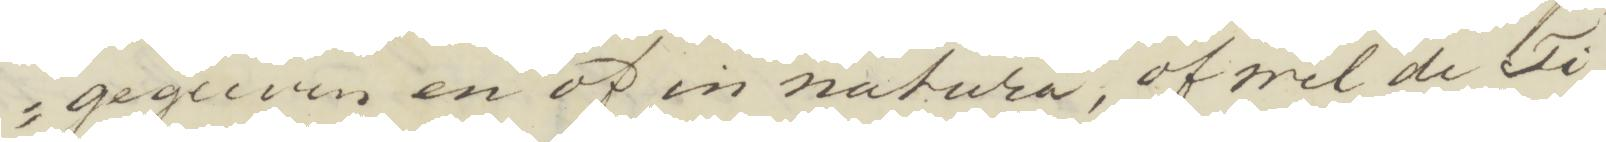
=gegeeven en of in natura, of wel de Ti:
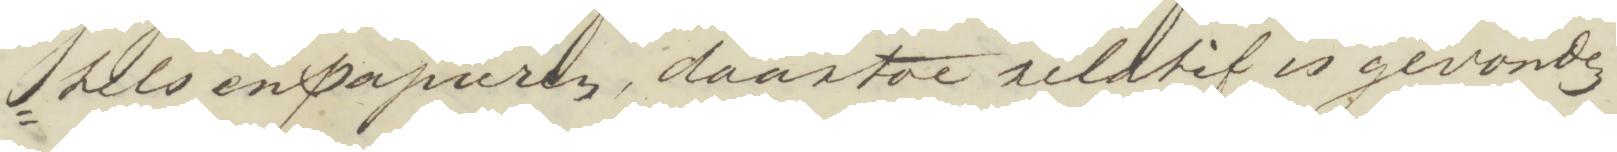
=tels en papieren, daartoe relatif is gevonden
